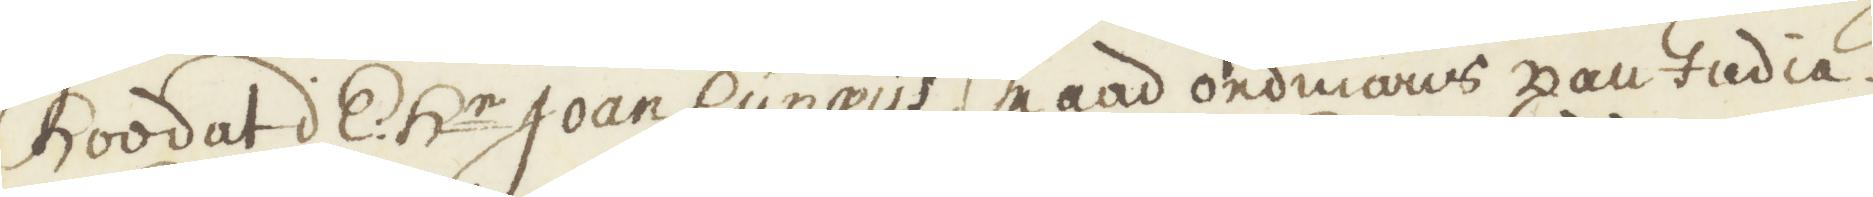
hoedat dE: H=r Joan Cunaeus raad ordinaris van India —
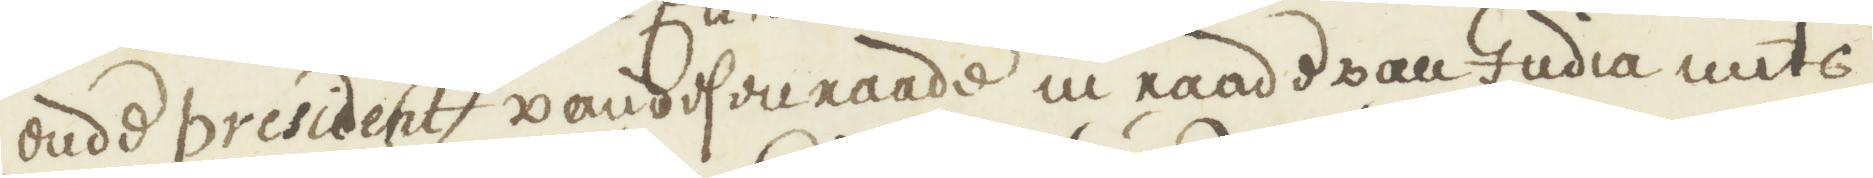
ende president van desen raade in raade van India mits
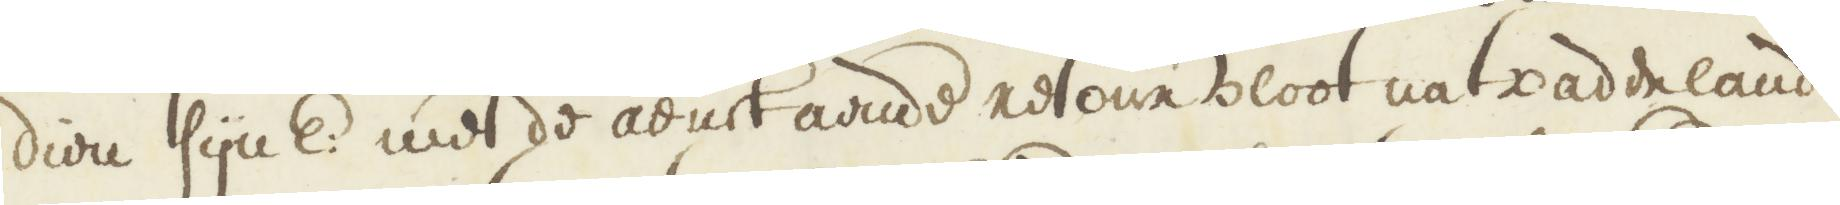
dien sijn E: met de aenstaende retour vloot na t vaderland —
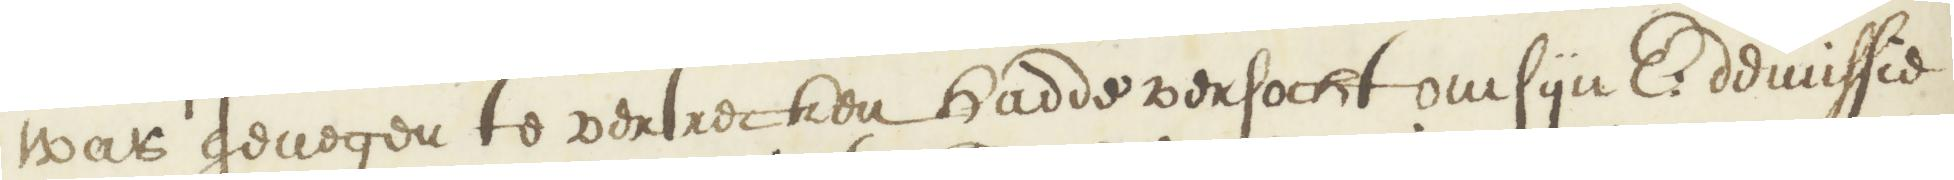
was genegen te vertrecken hadde versocht om sijn E: demissie
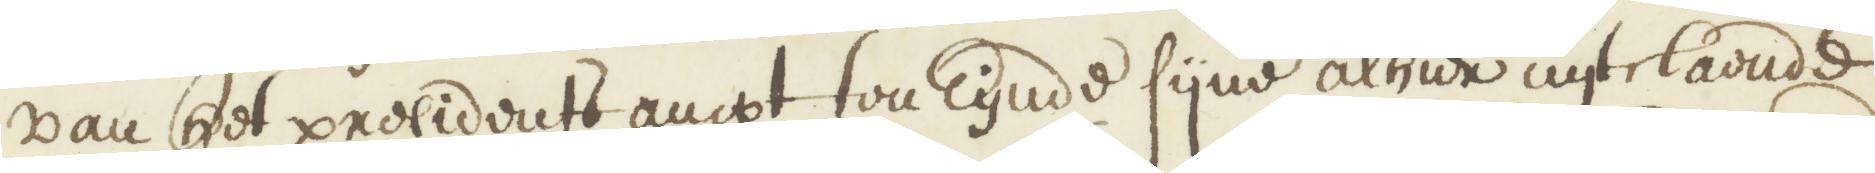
van het presidents ampt ten Eijnde sijne alhier uytstaende
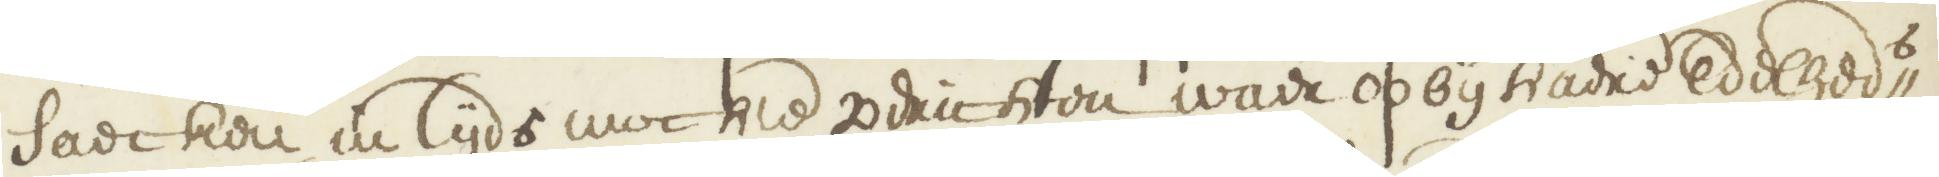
saecken in tijds mochte verichten waer op bij haere Edelhed„s
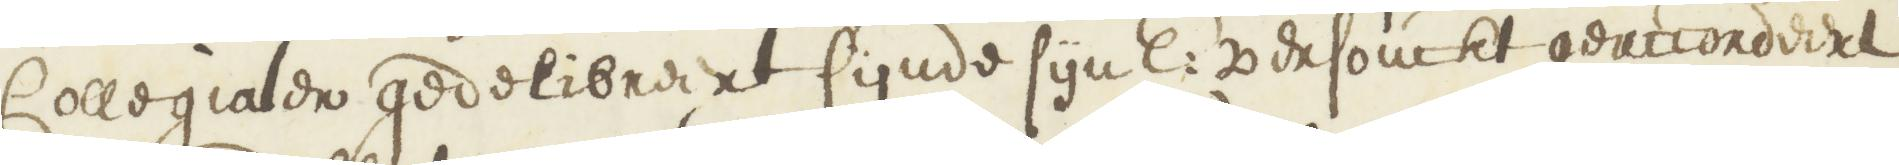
Collegiater gedelibreert sijnde sijn E: versouckt geaccordeert
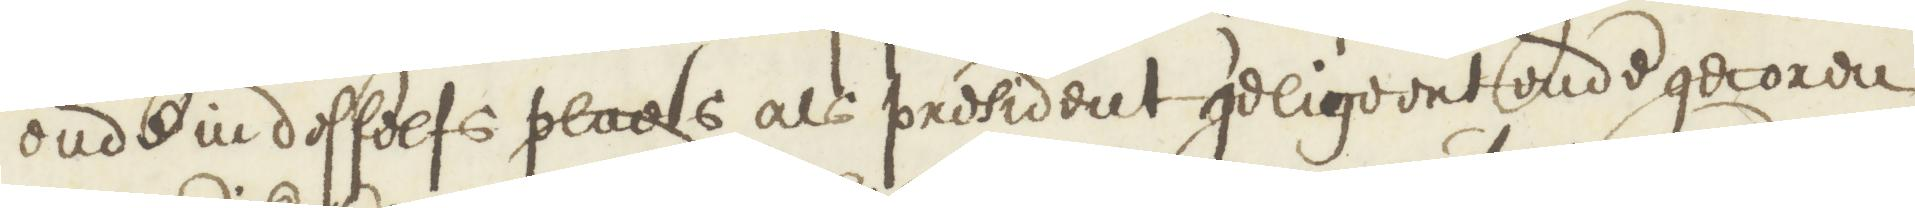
ende in desselfs plaets als president geligeert ende gecoren
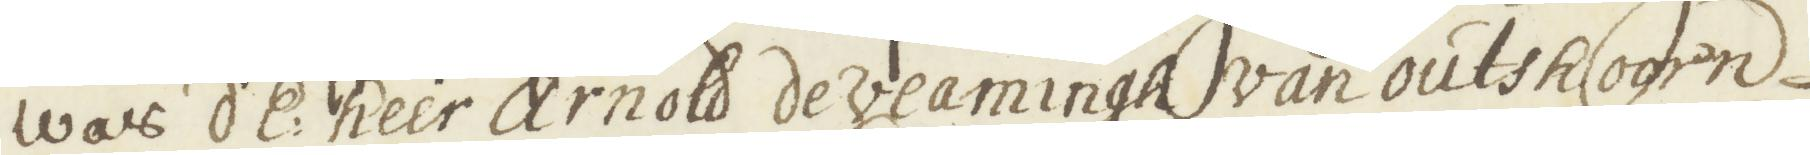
was d’E: heer Arnold de vlamingh van outshoorn —
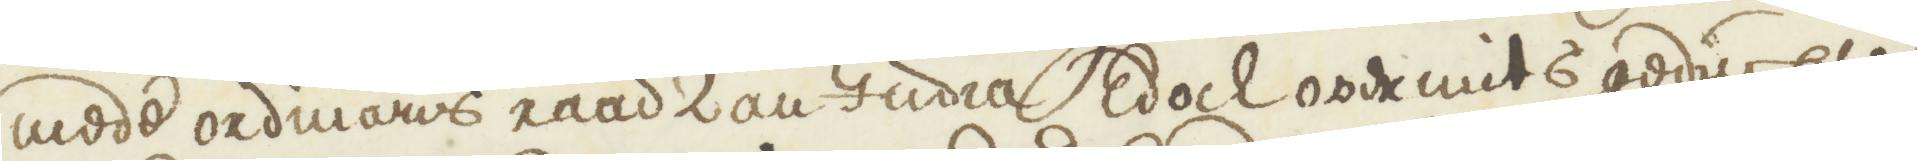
mede ordinaris raad Van India Edoch over mits geduchte
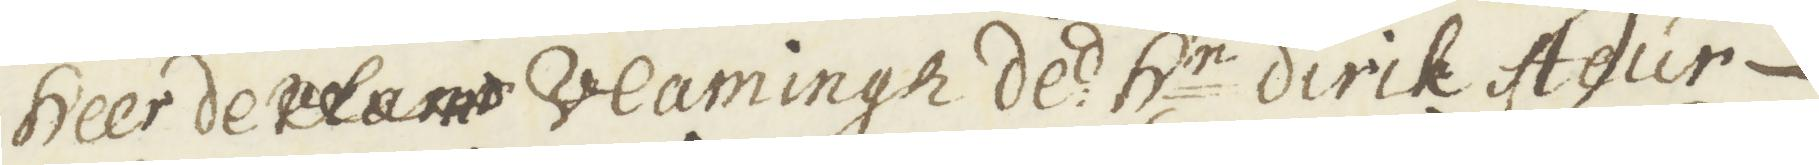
Heer de vlami Vlamingh de: E H=r dirik Agur —
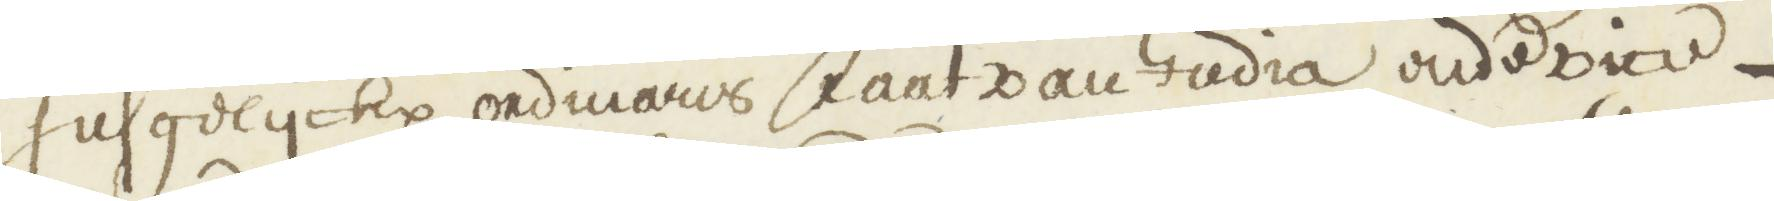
Jnsgelijckx ordinaris raat van India ende vice —
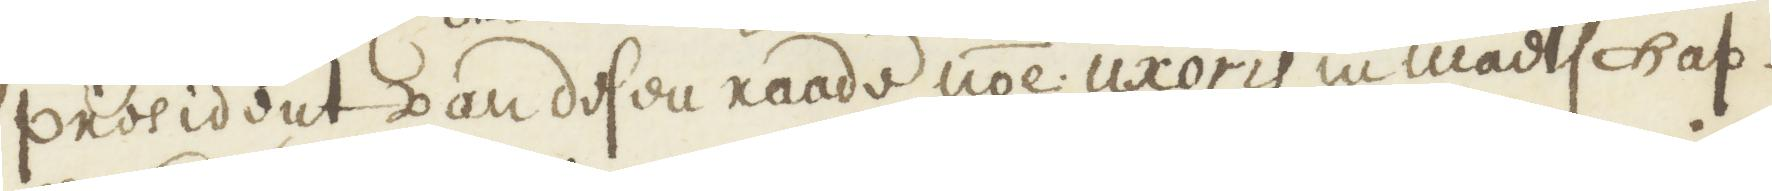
president van desen raade noe: uxoris in maetschap —
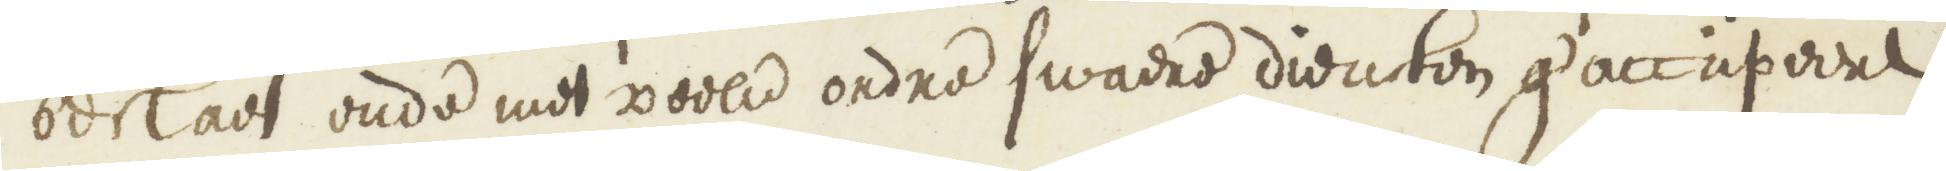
bestaet ende met veele ordre swaere diensten g’accupeert
